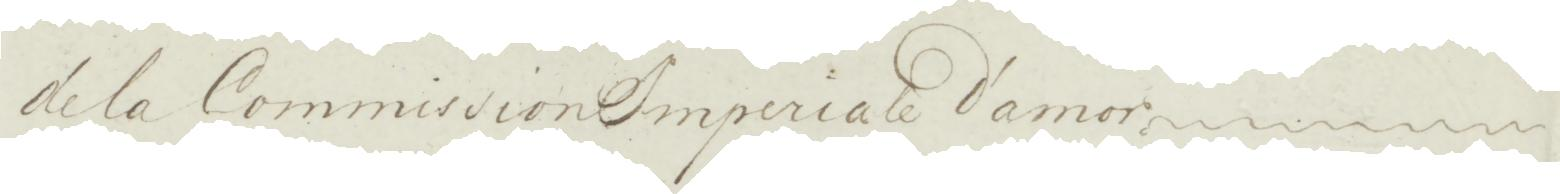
de la Commission Imperiale d'amor
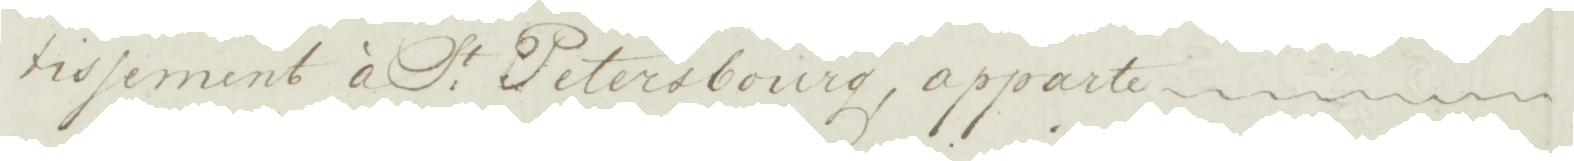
tissement à S:t Petersbourg, apparte —
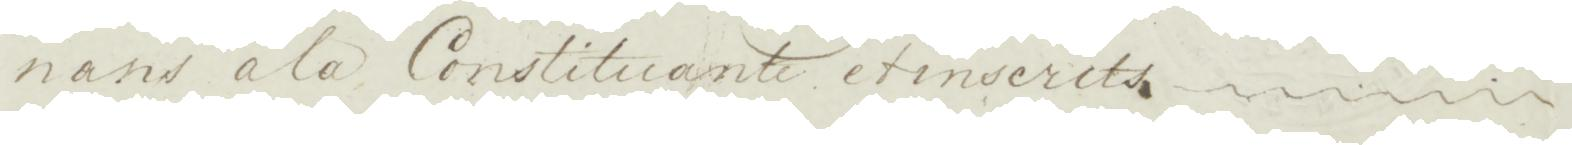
nans à la Constituante, etinscrits
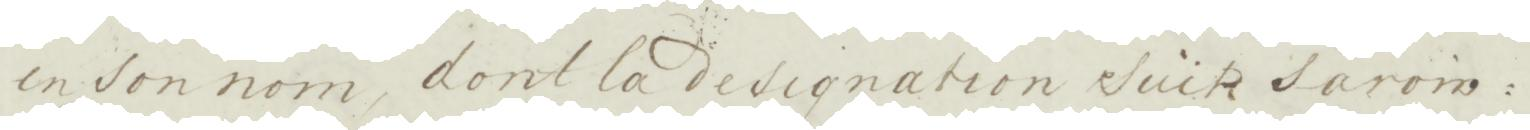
en son nom, dont la designation suit savoir:
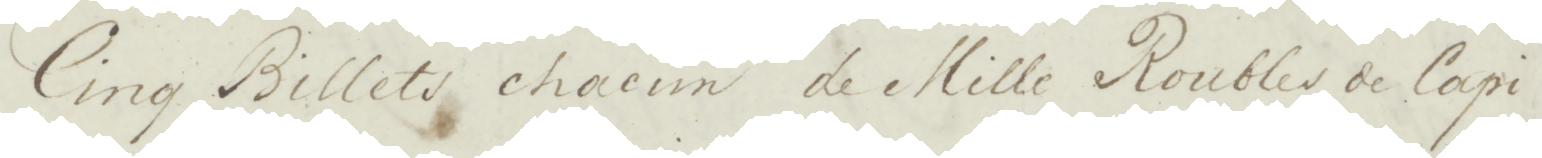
Cinq Billets chacun de Mille Roubles de Capi
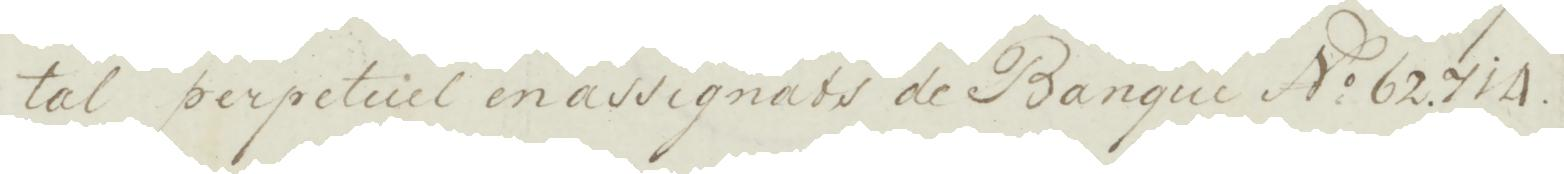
tal perpetuel en assignats de Banque N=o 62.714.
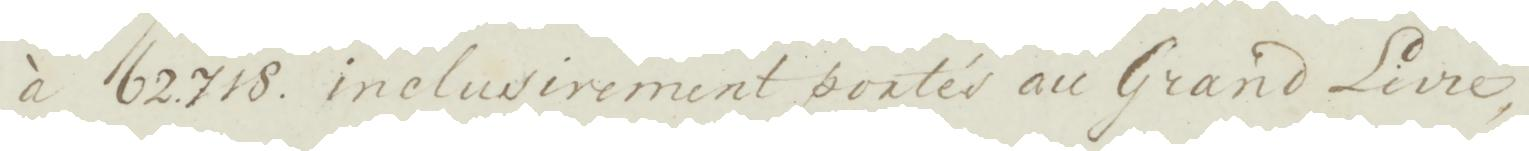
à 62.718. inclusivement portés au Grand Livre,
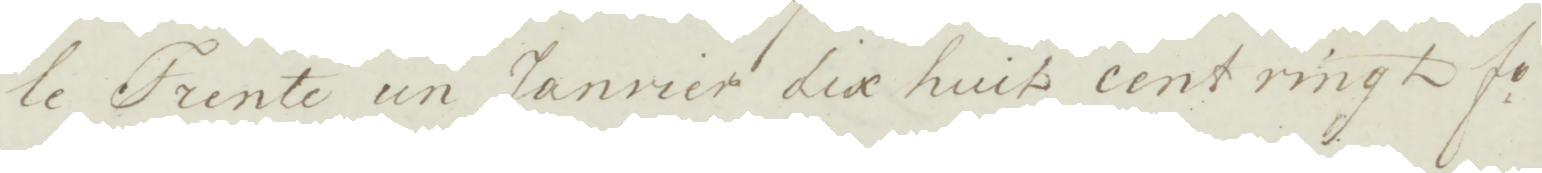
le Trente un Janvier dix huit cent vingt f=o
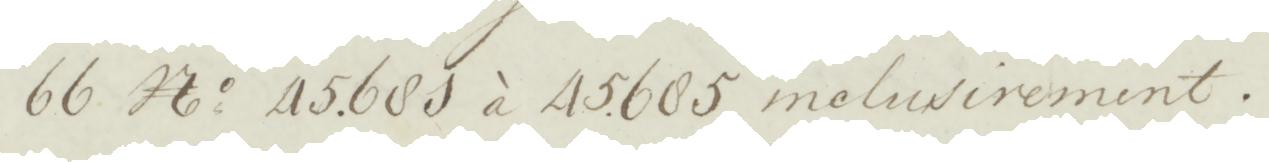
66 N=o 45.681 à 45.685 inclusivement.
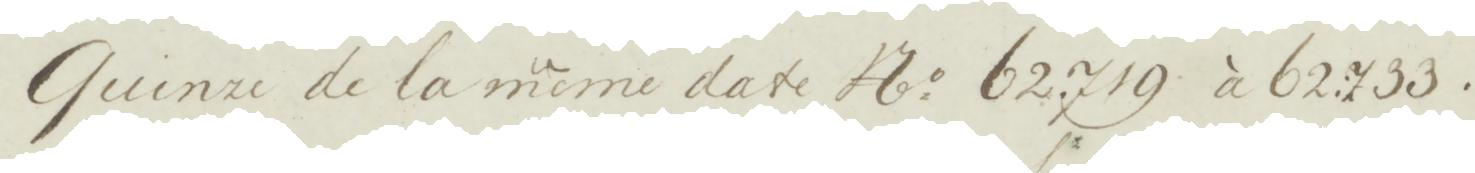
Quinze de la même date N:o 62.719 a 62:733.
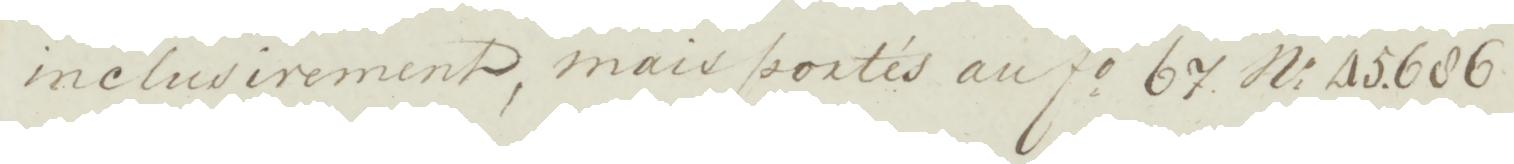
inclusivement, mais portés au f=o 67. N:o 45.686
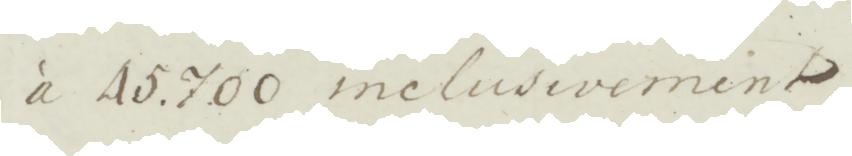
à 45.700 inclusivement
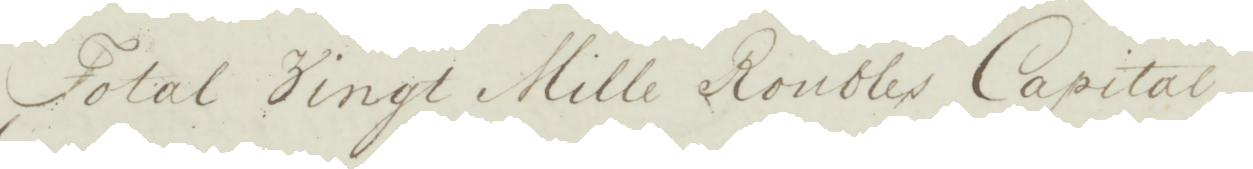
Total Vingt Mille Roubles Capital
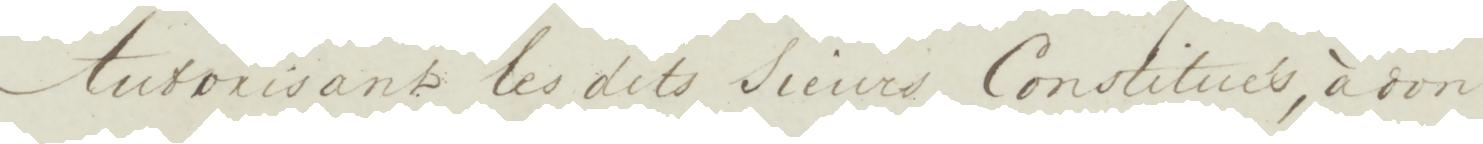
Autorisant les dito Sieurs Constitués, à don
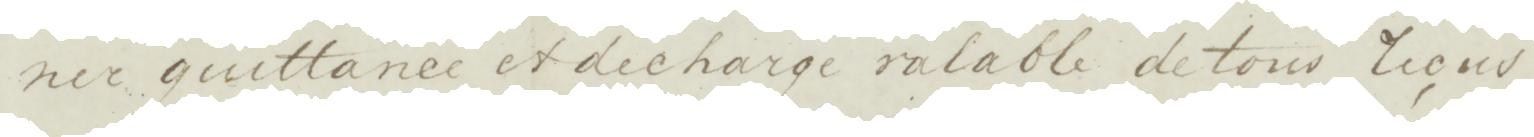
ner quittance et decharge valable de tous reçus
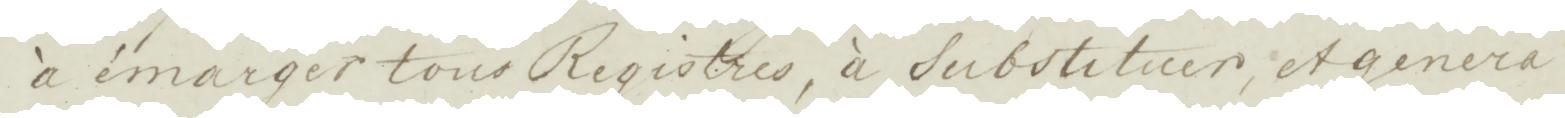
à émarger tous Registres, à substituer, et genera
